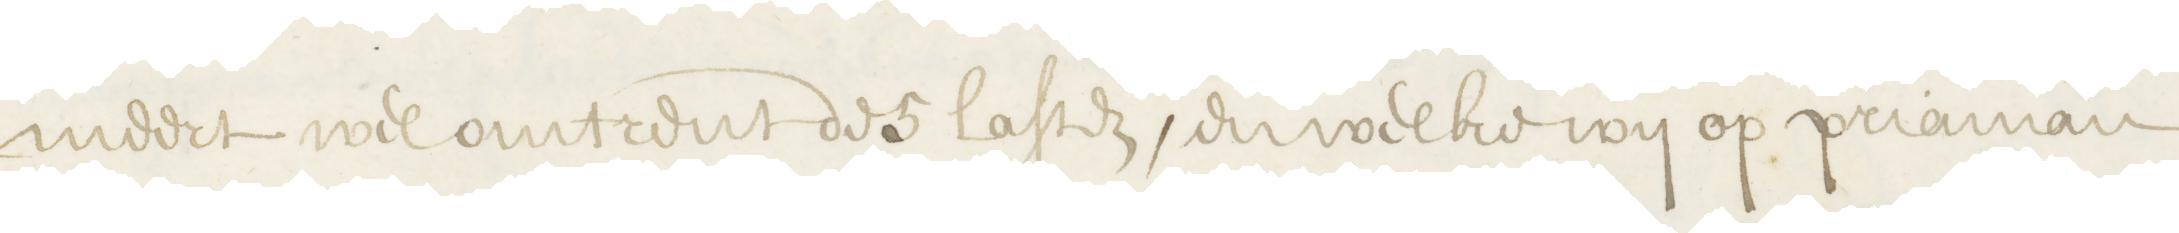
meert wel omtrent de 5 lasten, en welke wij op priaman
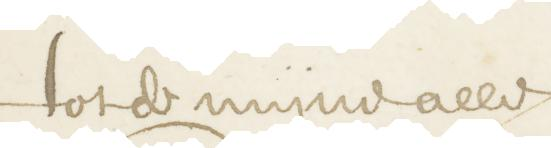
tot de mijne alle
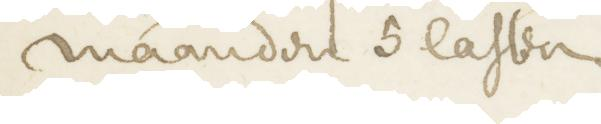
maanden 5 lasten
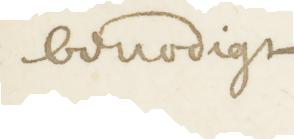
benodigt
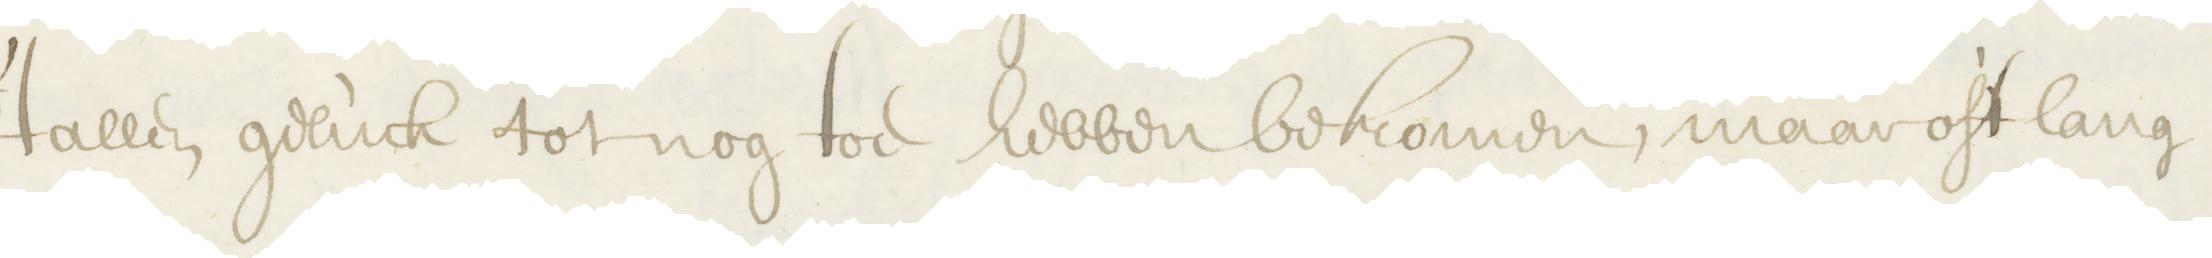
'tallen geluck tot nog toe hebben bekomen, maar of't lang
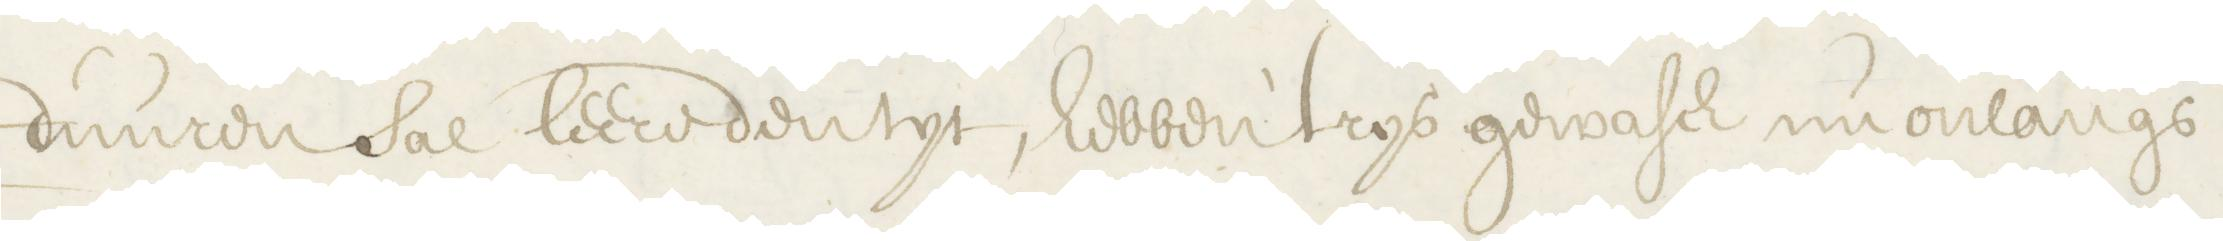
duuren sal leere den tyt, hebben 'trys gewasch nu onlangs
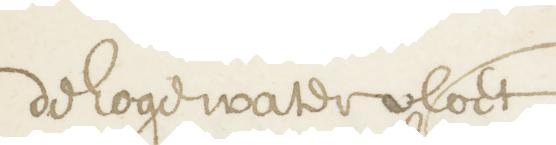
de hogewater vloet
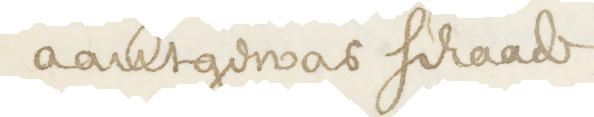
aantgewas schaade
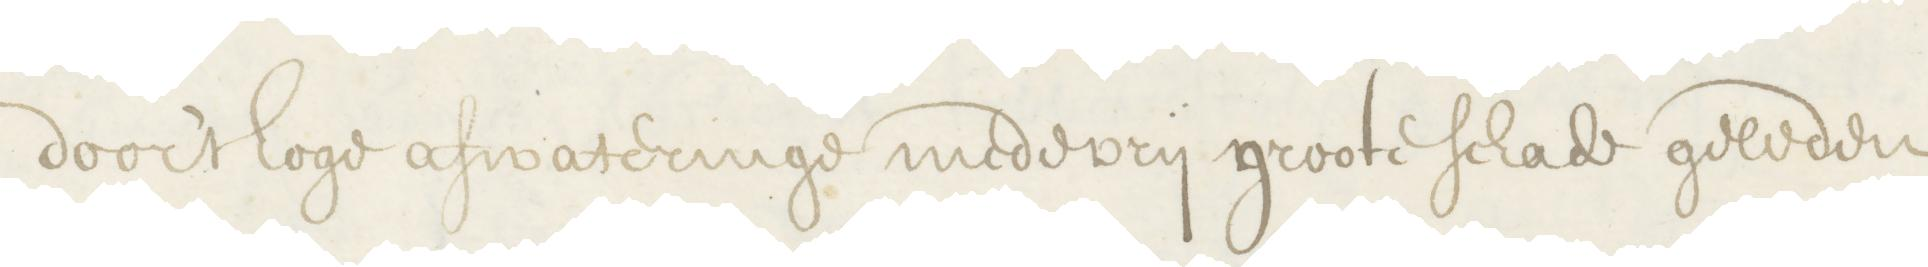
door ’t hoge afwateringe mede vrij groote schade geleden
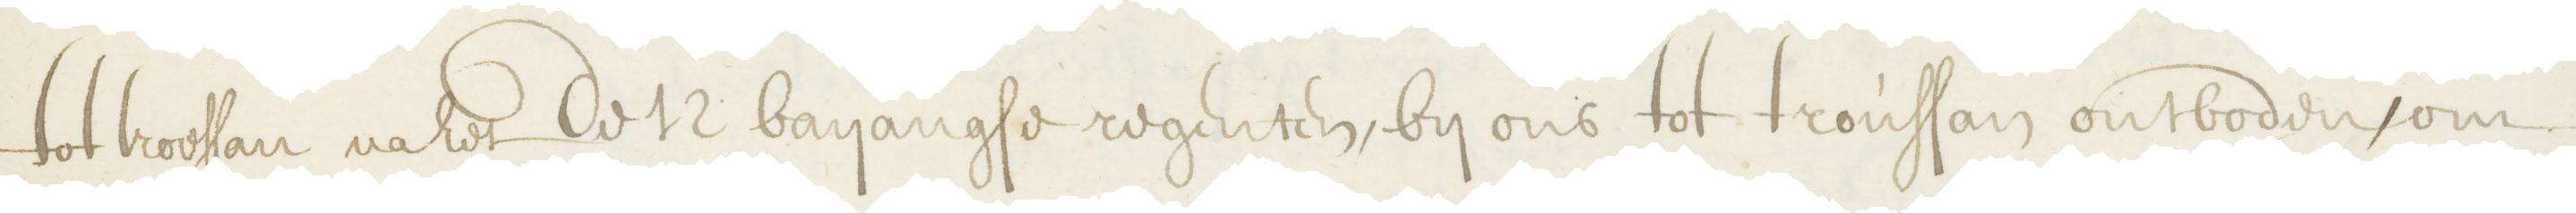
tot troessan na het de 12 baijangse regenten, bij ons tot troussan ontboden, om
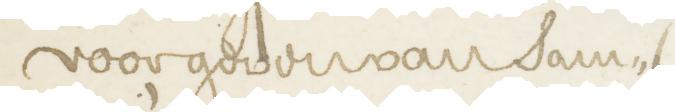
voor geven van sam„
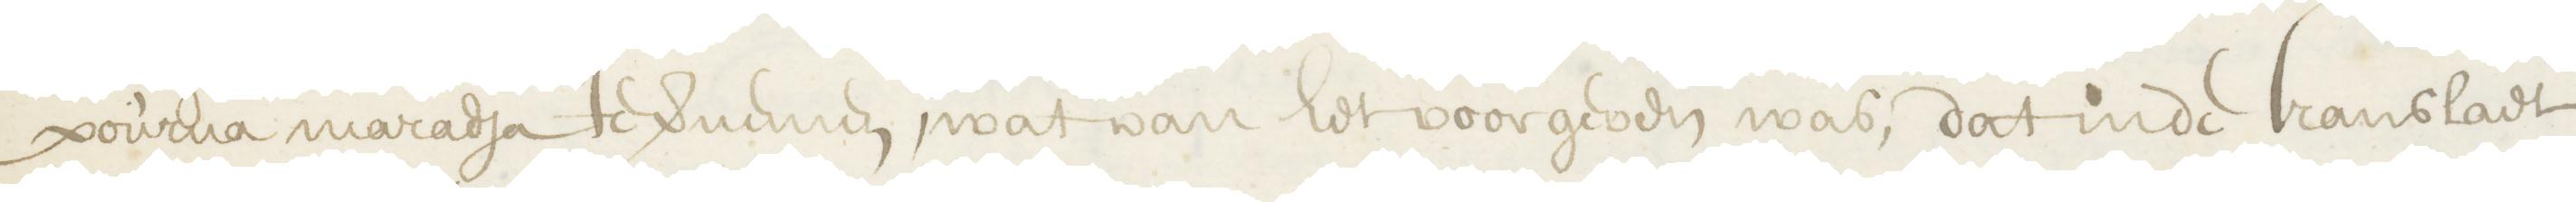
pourna maradja te vernemen, wat van het voorgeven was, dat in de translaet
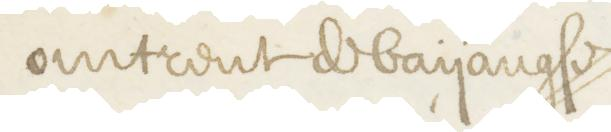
omtrent de baijangse
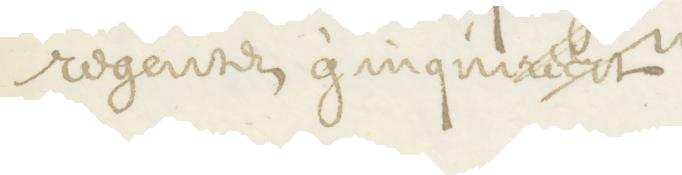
regenten g’ inquireert.
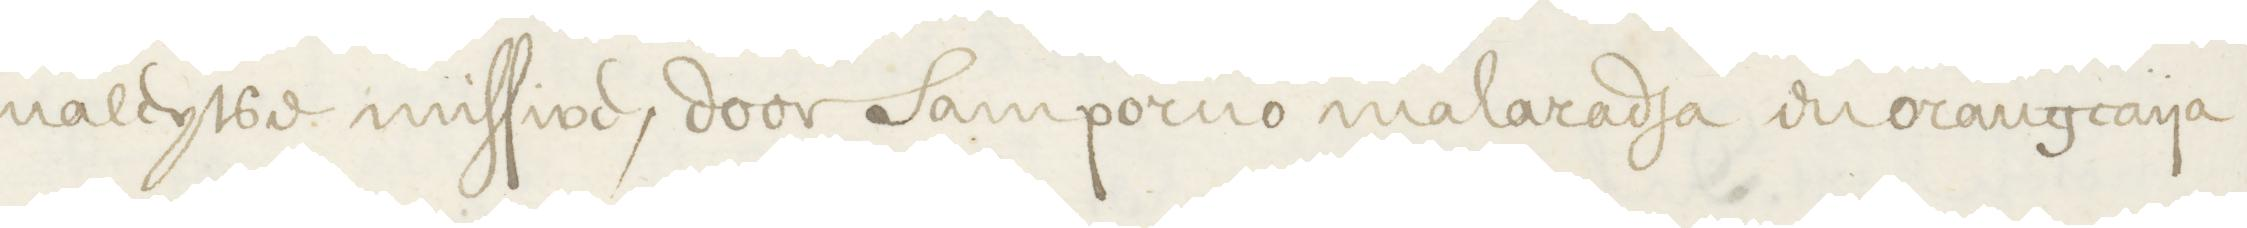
maleytse missive, door Samporno maharadja en orangcaija
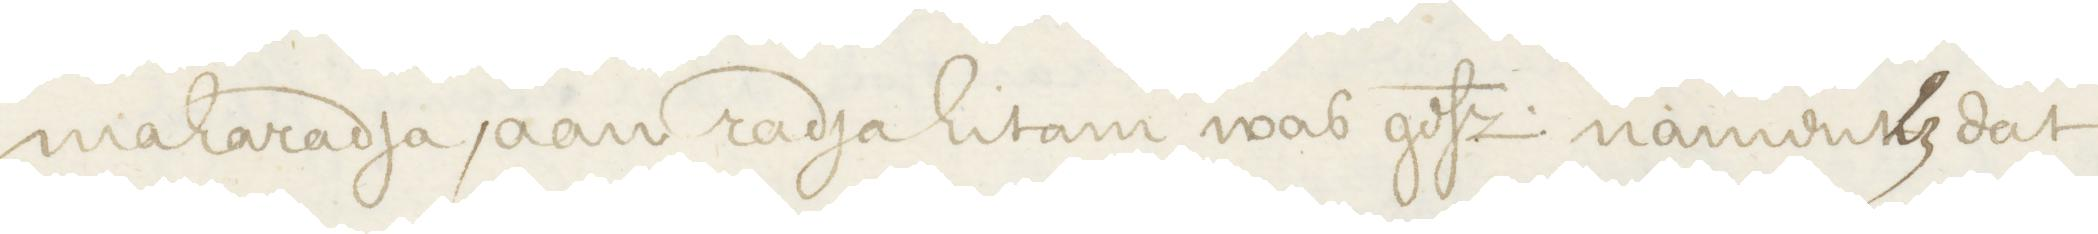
maharadja, aan radja hitam was gesz: namentlijk dat
